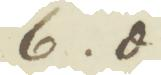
6. d
